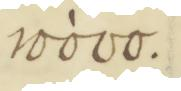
10'000.
